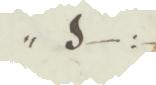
„ 1 —:
